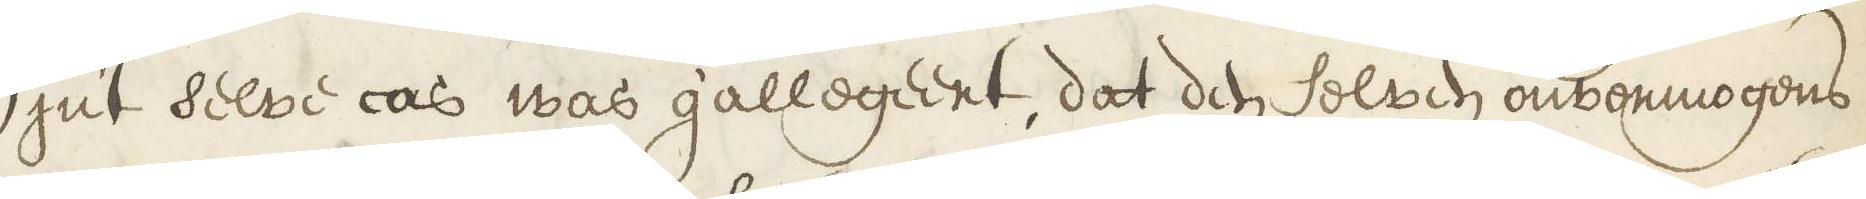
jn't selve cas was g’allegeert, dat den selven onvermogens
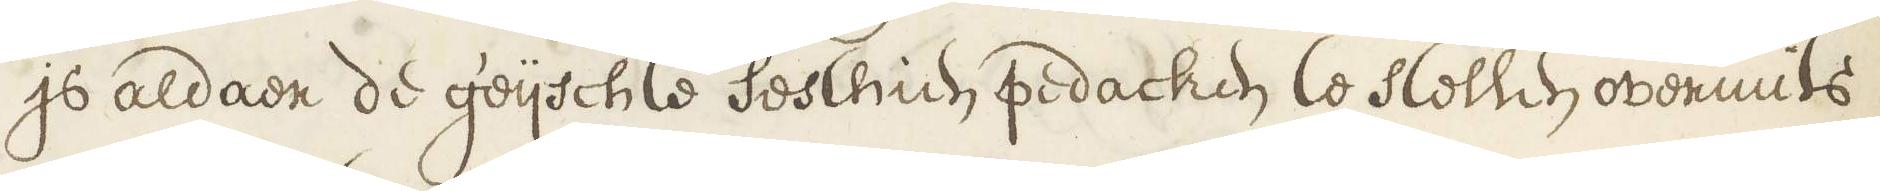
js aldaer de g'eijschte sesthien pedacken te stellen overmits
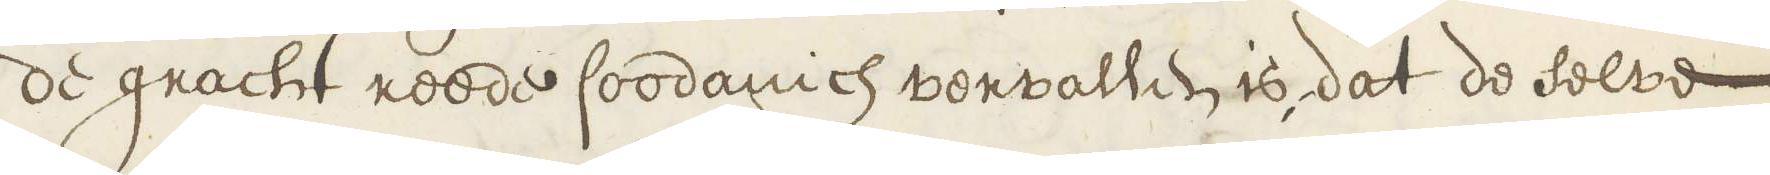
de gracht roode soodanich vervallen is, dat de selve
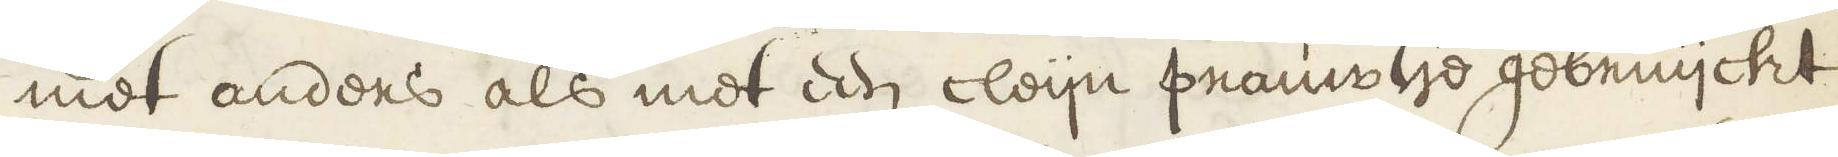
niet anders als met een cleijn prauwtje gebruijckt
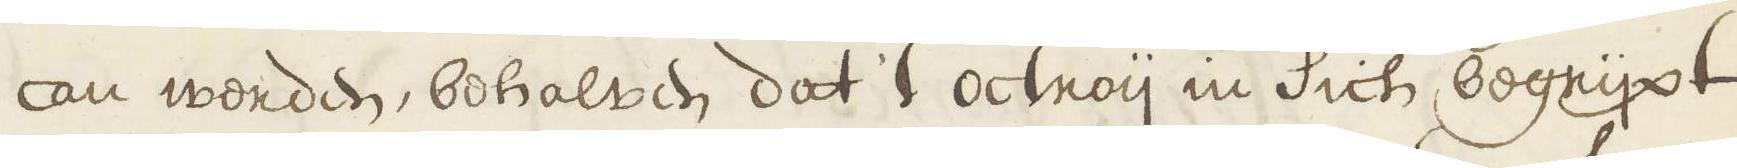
can werden, behalven dat ’t octroij in sich begrijpt
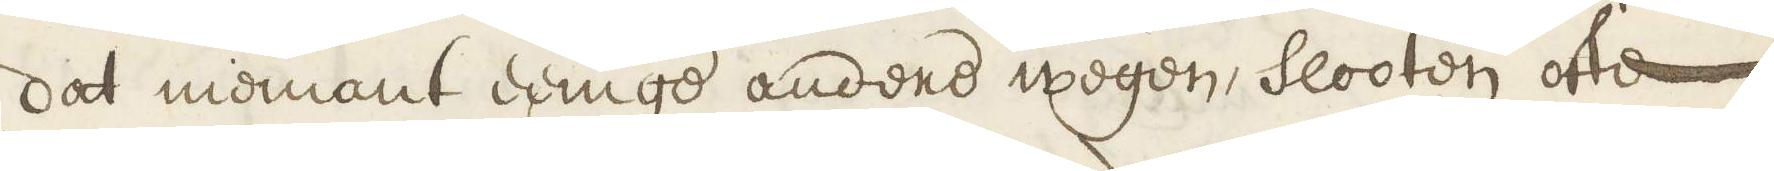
dat niemant eenige anders wegen, slooten ofte
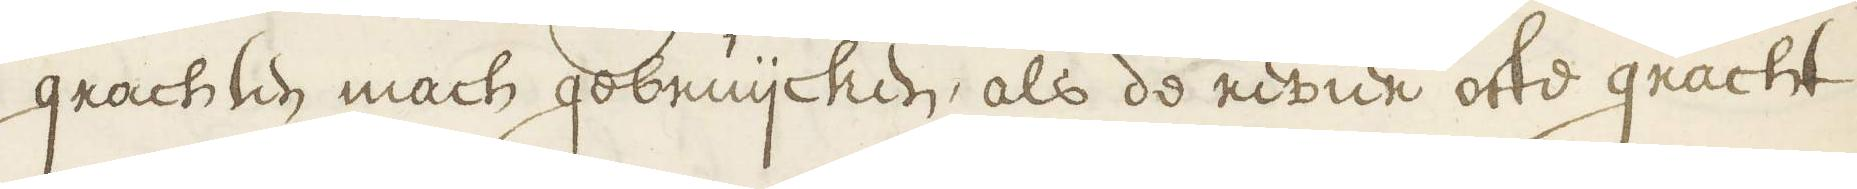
grachten mach gebruijcken, als de revier ofte gracht
